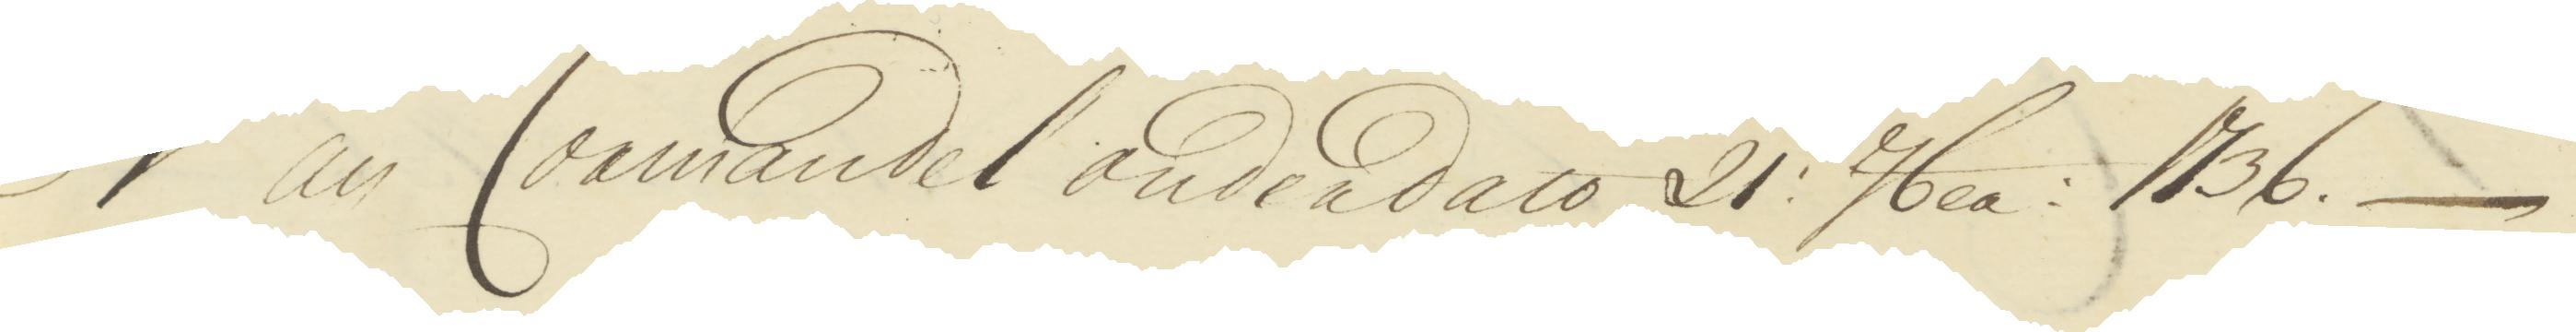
Van Cormandel onderdato 21:' 7ber: 1736. —
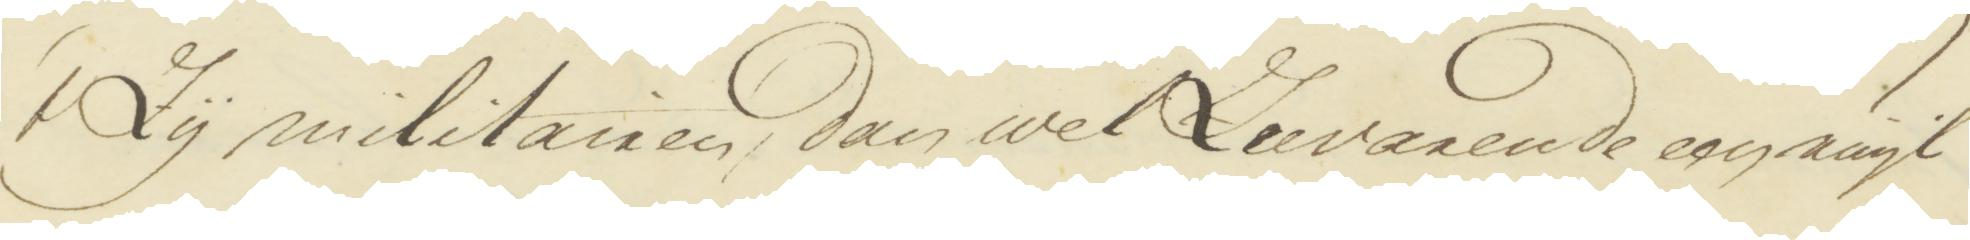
’t zij militairen, dan wel zeevarende een ruijl
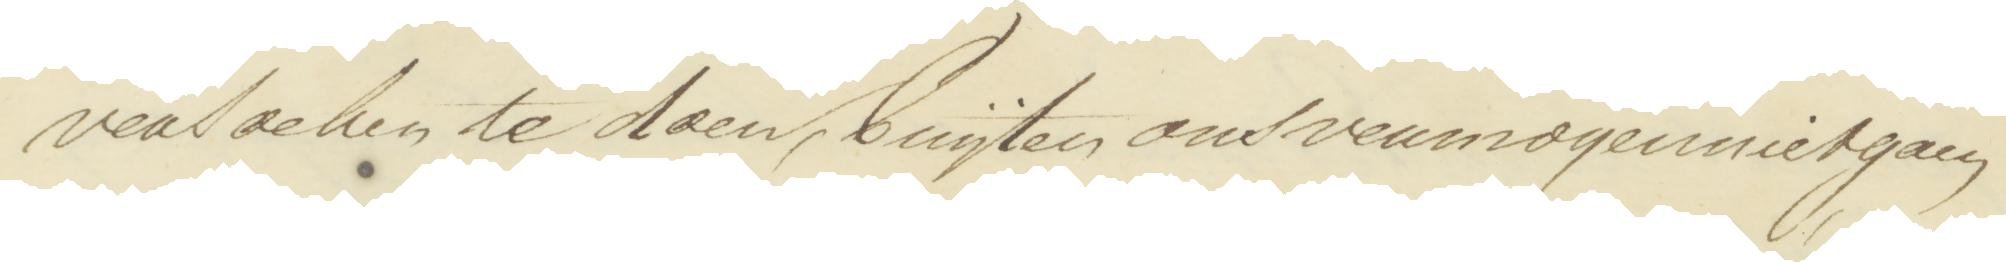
versoeken te doen, buijten ons vermogennietgaen
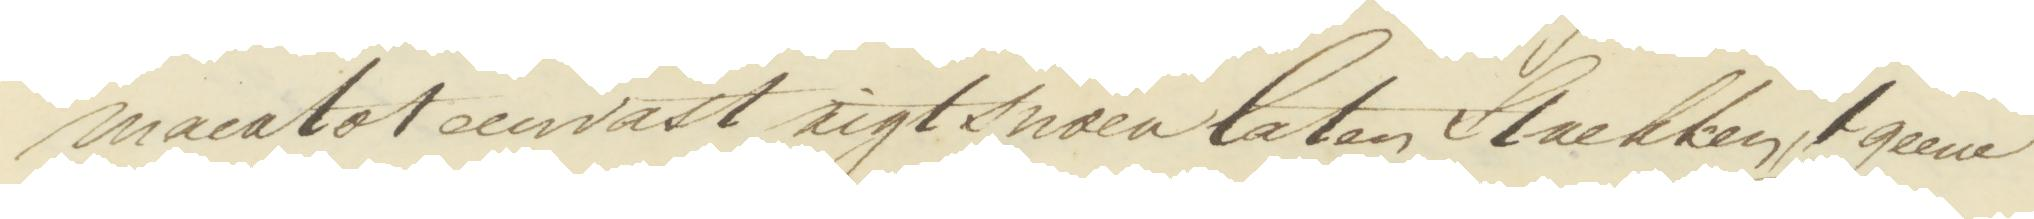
maertot eenvast rigtsnoer laten strekken, 't geene
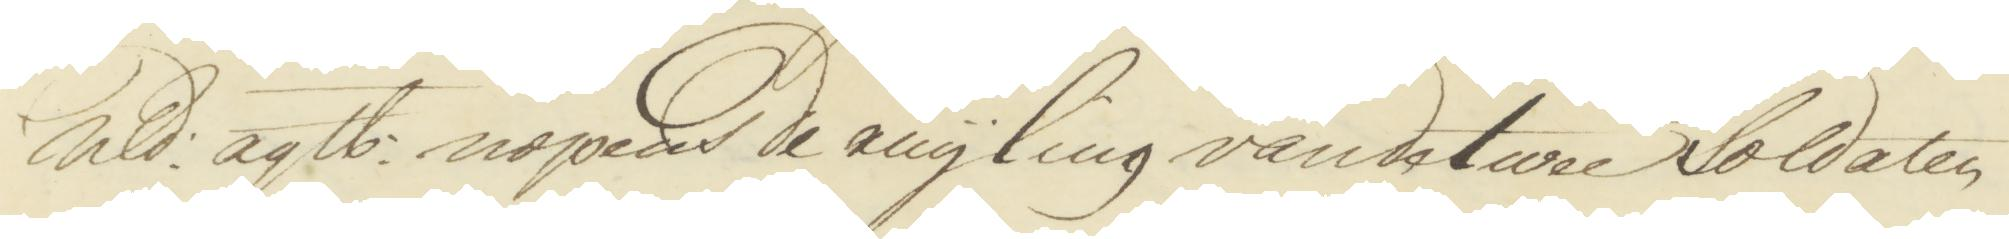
uEd: agtb: nopens de ruijling van de twee soldaten
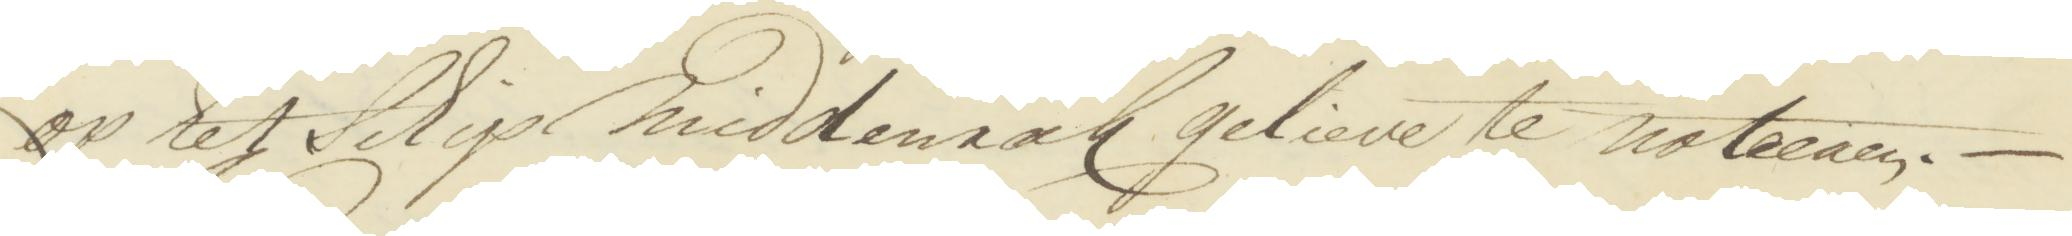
op het schip Middenrak gelieve te noteeren. —
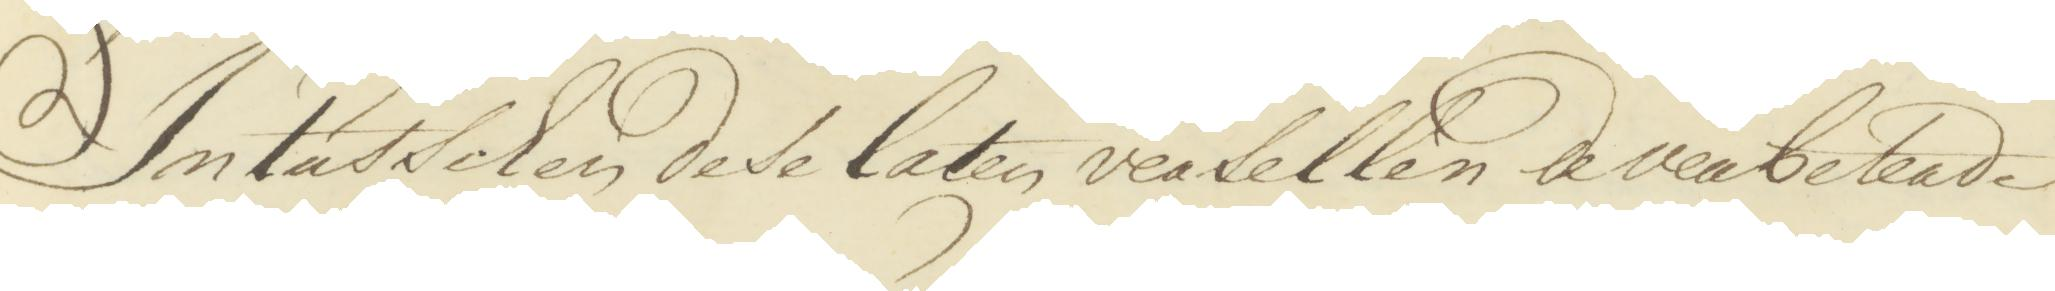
Intusschen dese laten versellen de verbeterde
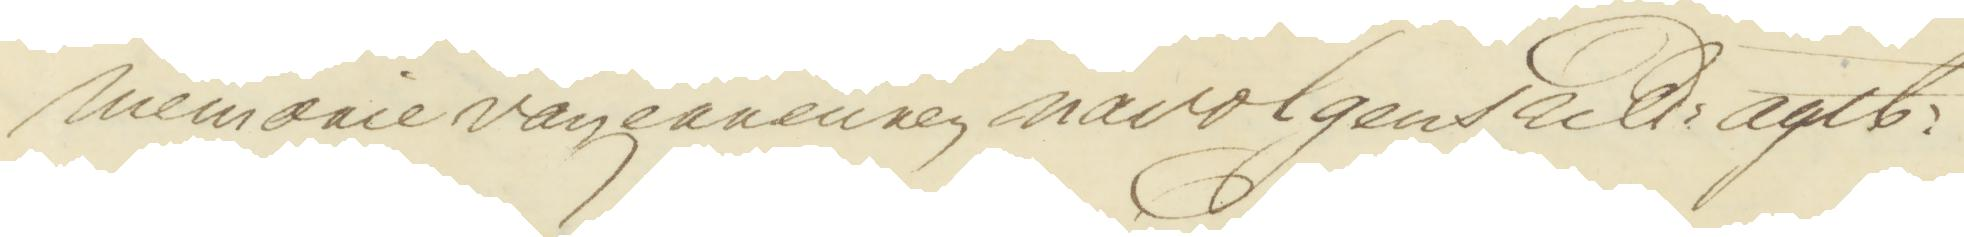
memorie van erreuren navolgens uEd: agtb:
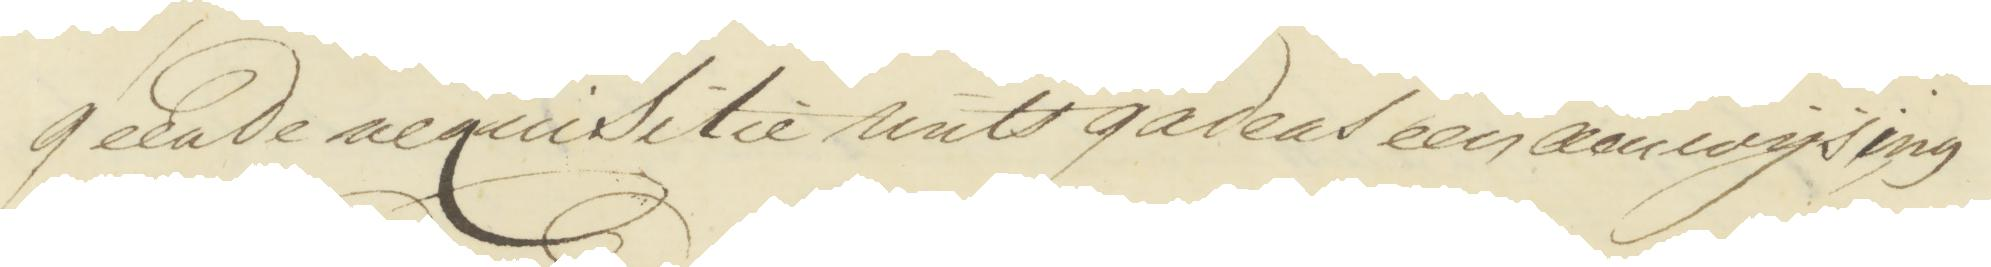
g'eerde requisitie mitsgaders een aanwijsing
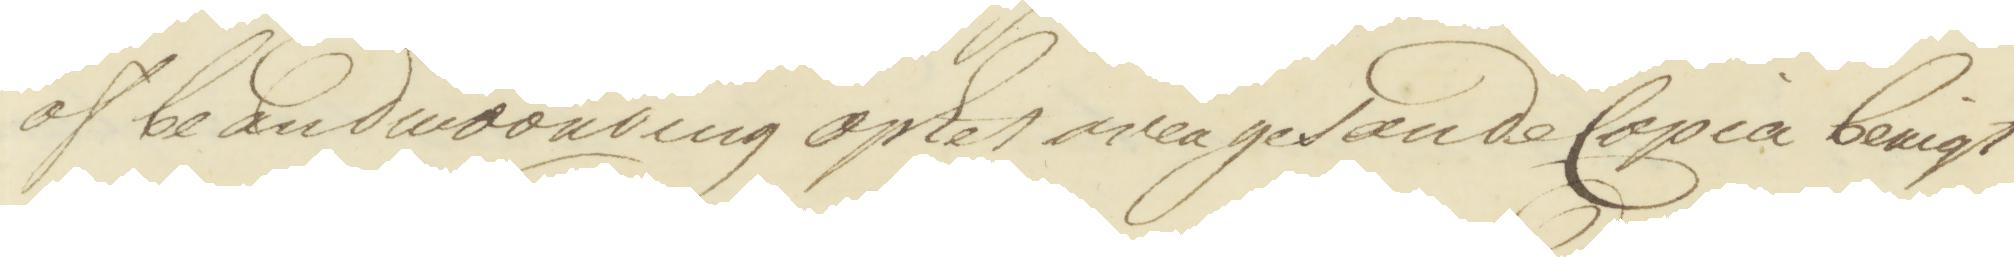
of beandwoording ophet overgesende Copia berigt
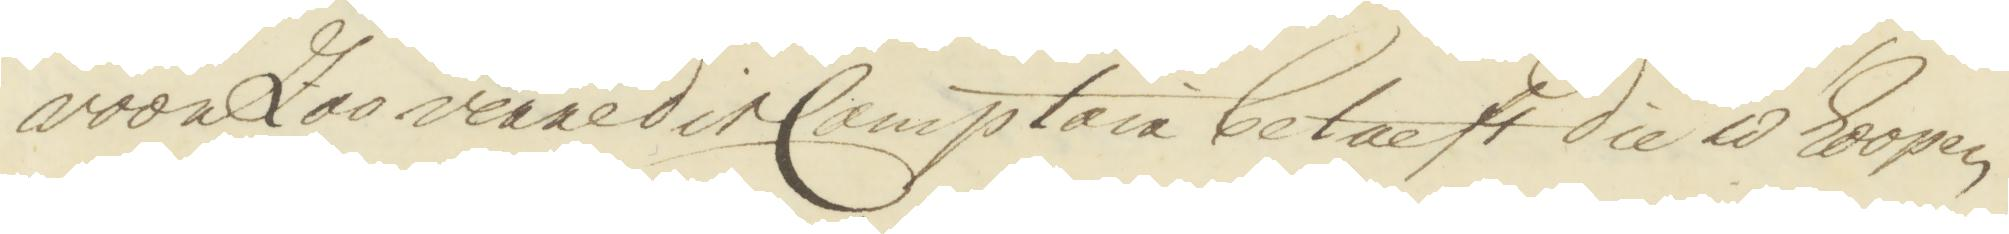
voor zoo verre dit Comptoir betaeft die w' hoopen
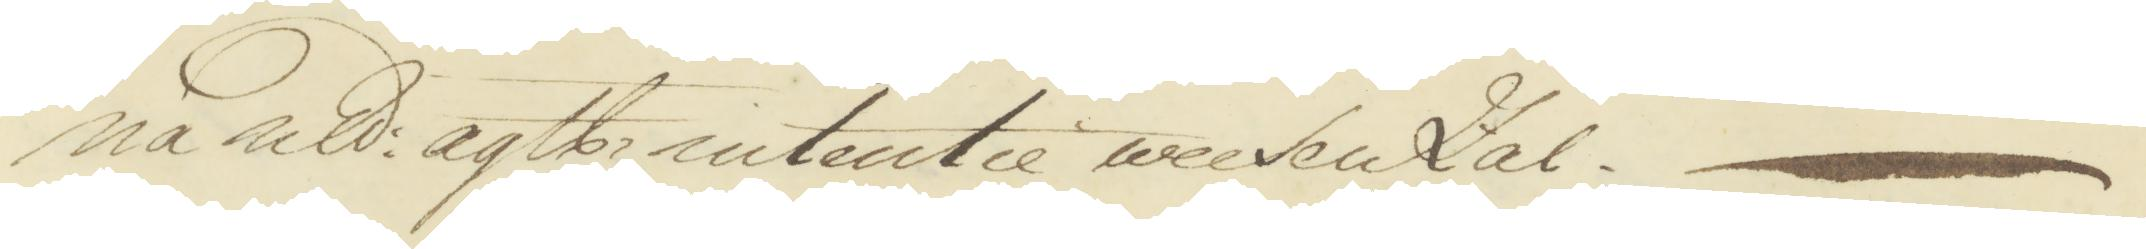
na uEd: agtb: intentie weesen zal. —
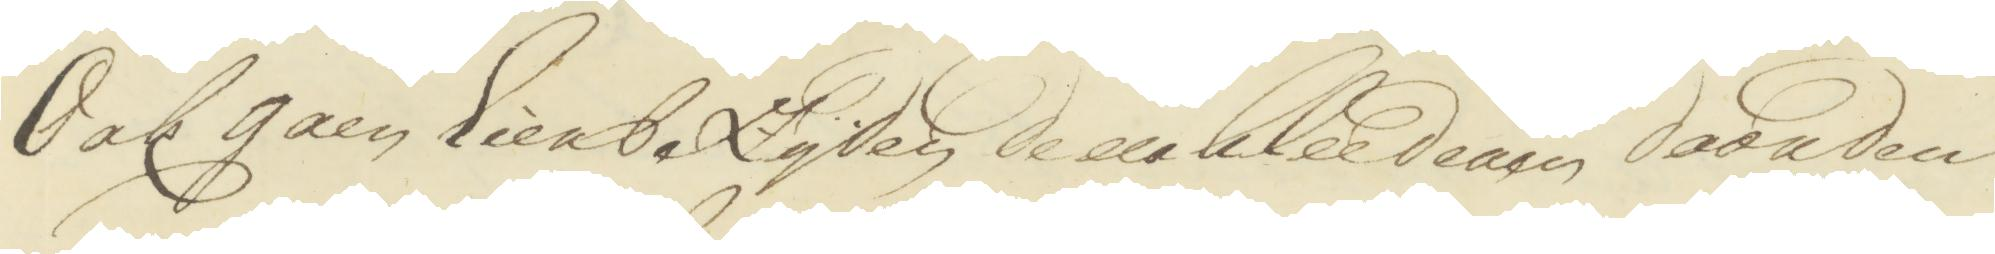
Ook gaen hierbezijden de eer kleederen door den
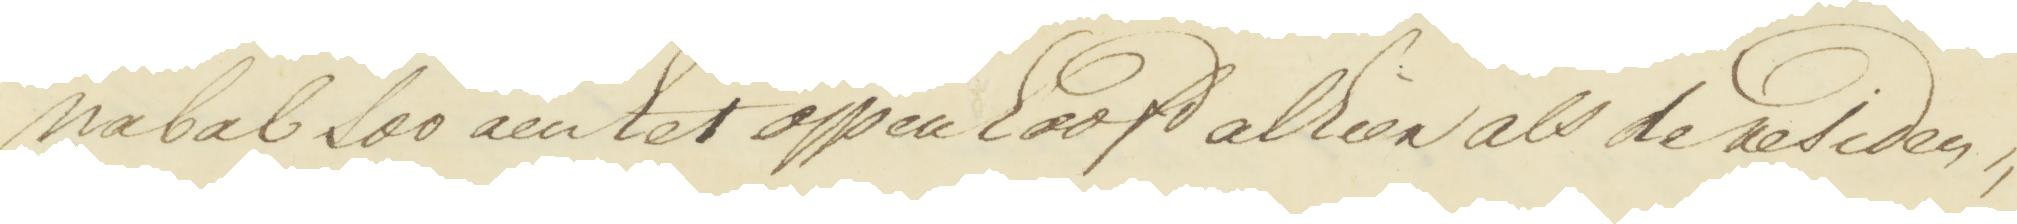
Nabab soo aen het opperhoofd alhier als de residen„
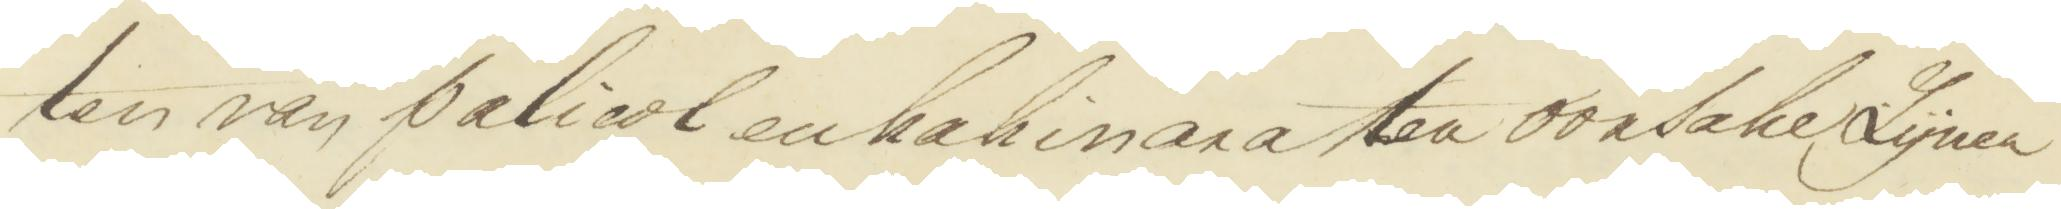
ten van palicol en kakinara ter oorsake zijner
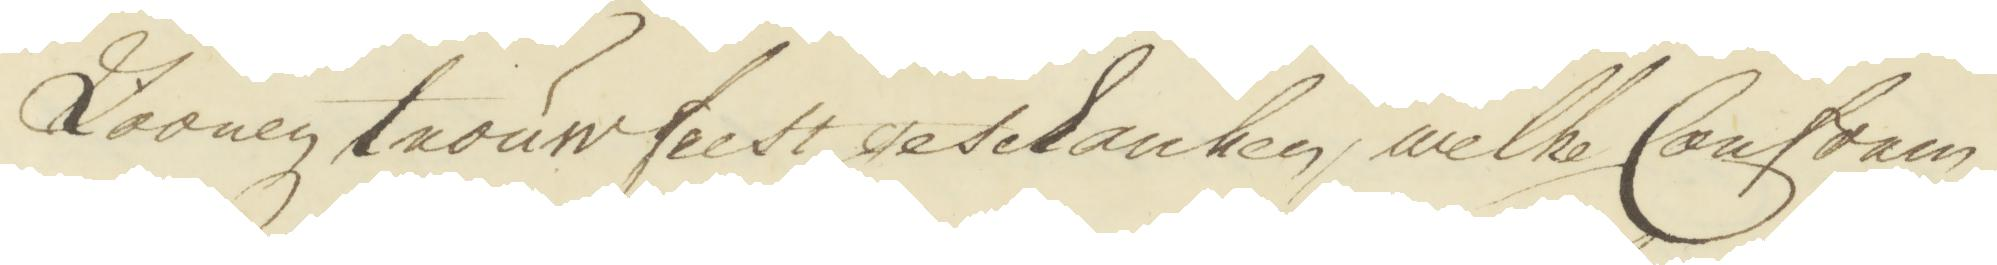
zoonen trouwfeest geschanken, welke Conform
